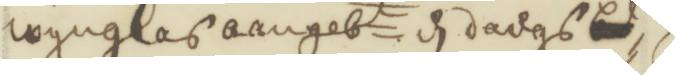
wijnglas aangeb=t en daegs de„
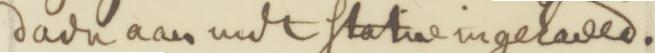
daer aan met statie ingehaeld.
